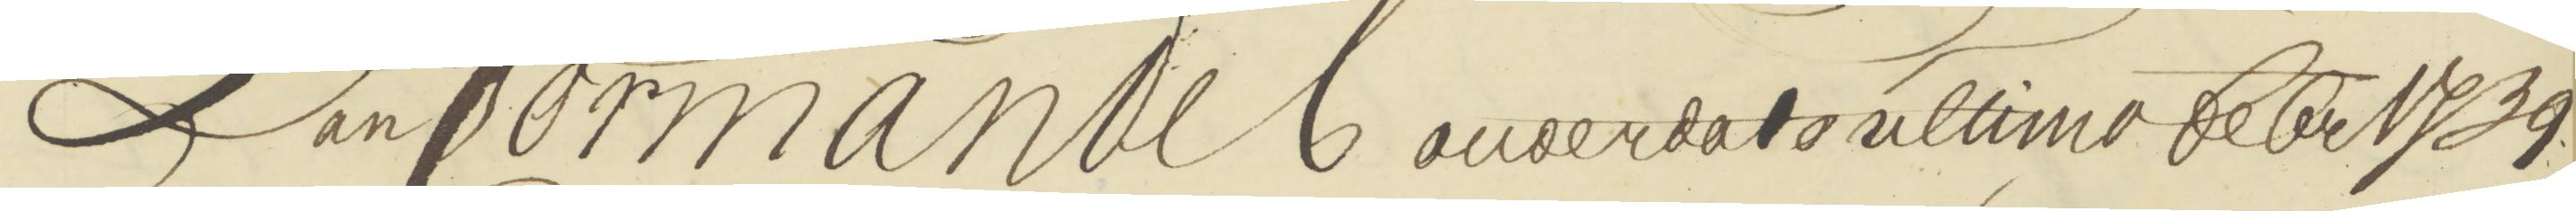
Van Cormandel onderdato ultimo febr 1739.
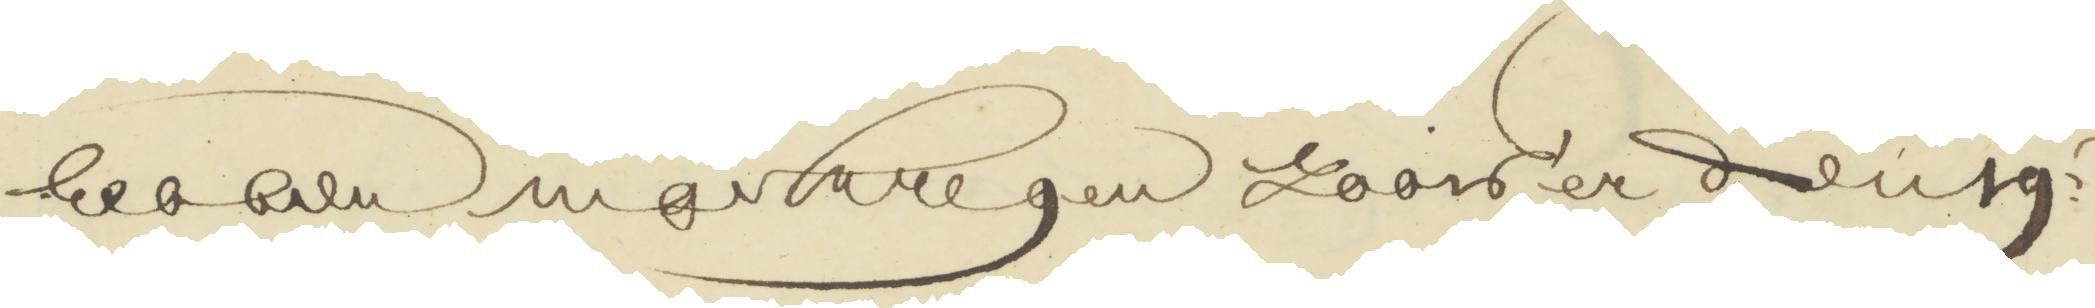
hebben ingekregen zoo is 'er den 19:'
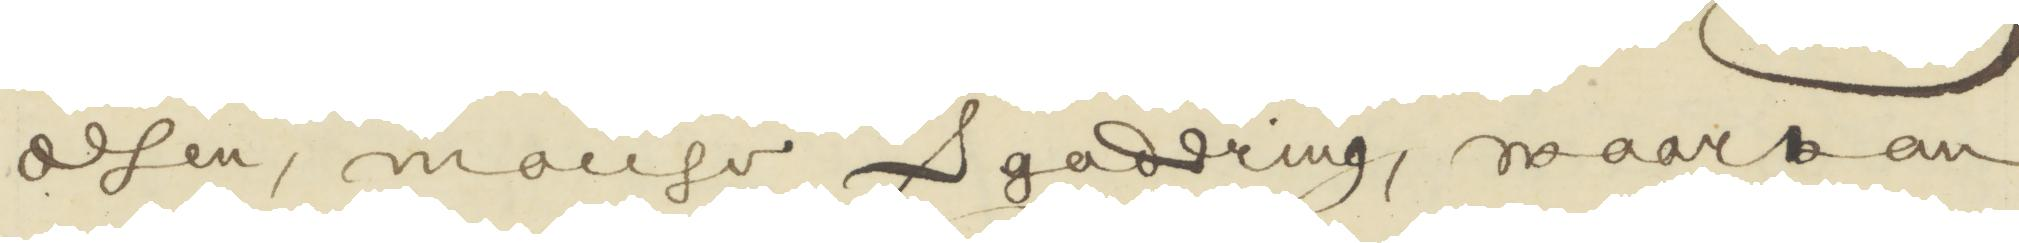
desen, in onse vergadering, waar van
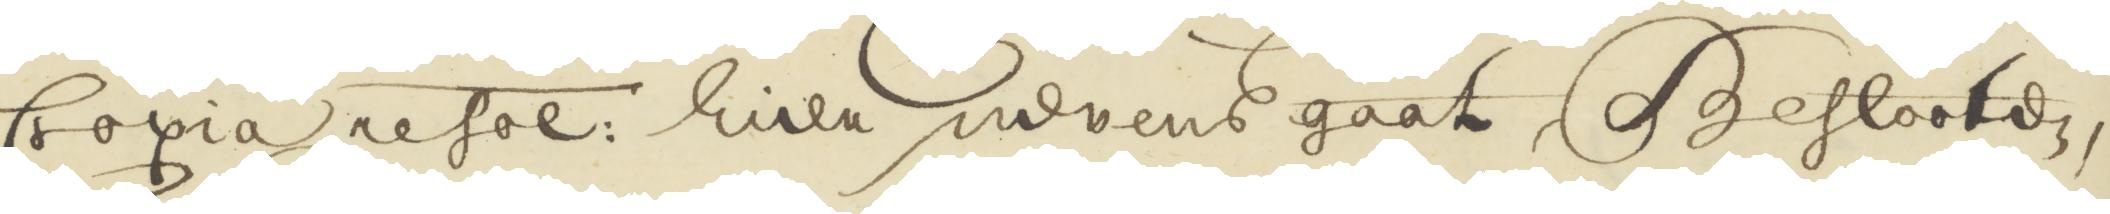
Copia resol: hier nevens gaat, Beslooten,
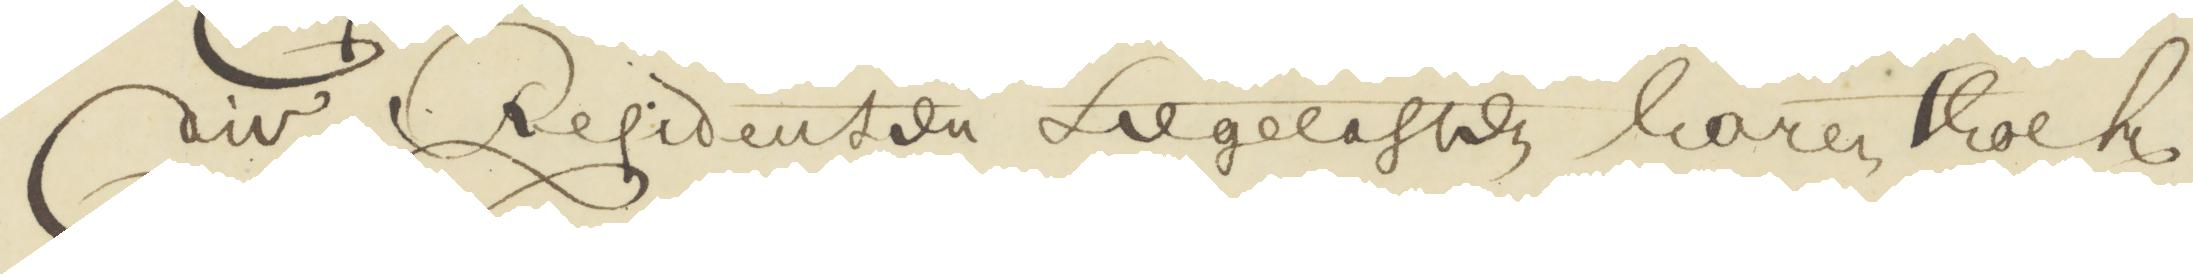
die Residenten te gelasten haren thoek
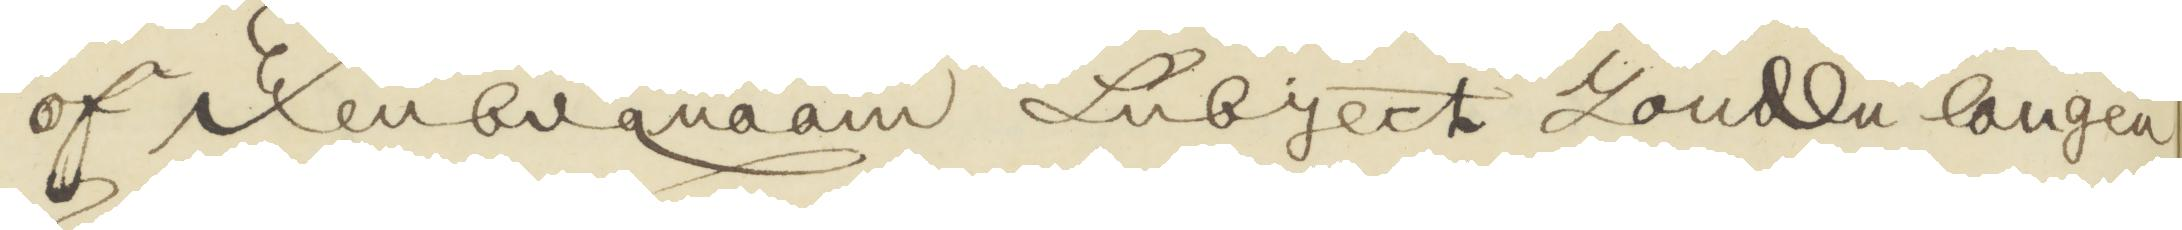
of Een bequaam subject zonder langer
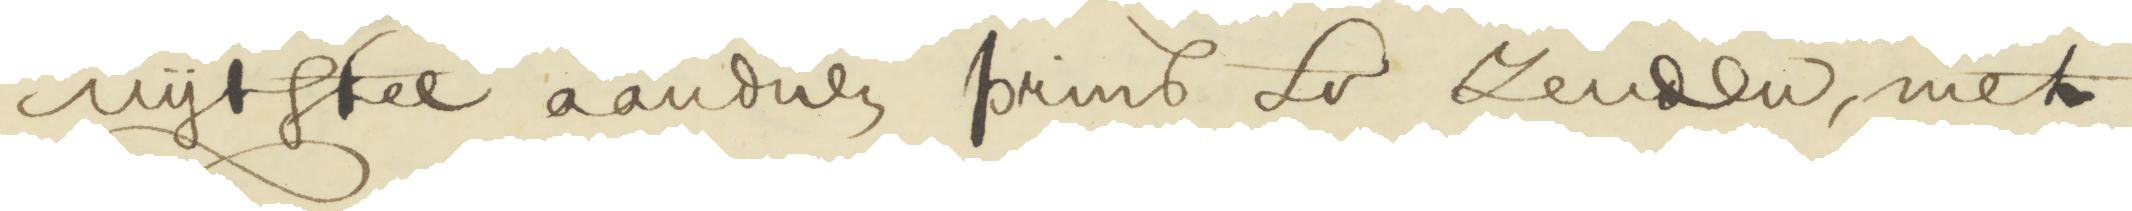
uijtstel aandien prins te zenden, met
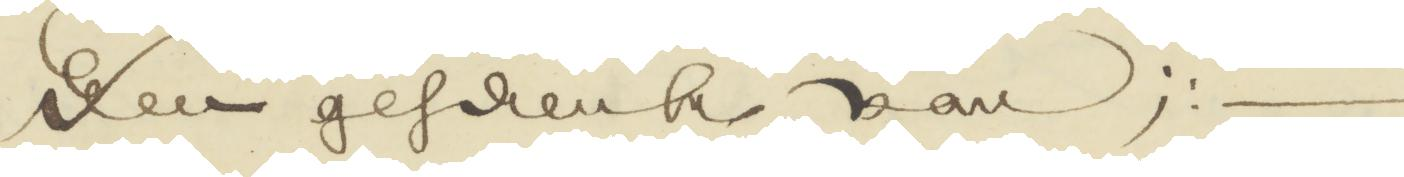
Een geschenk van;:
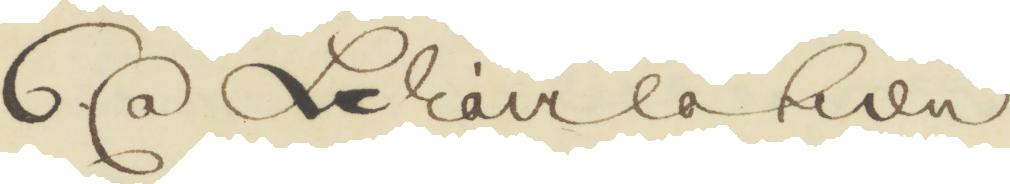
6. @ schairlaken
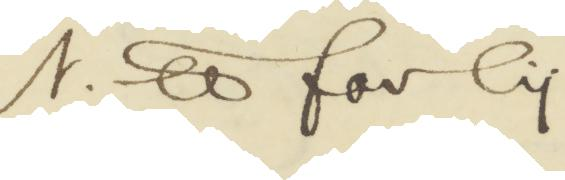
1. lb foelij
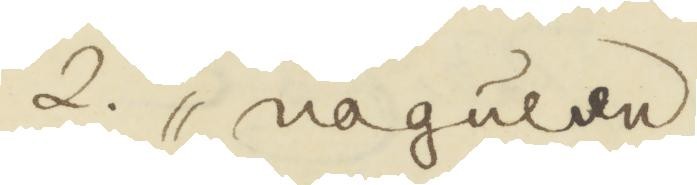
2. „ nagulen
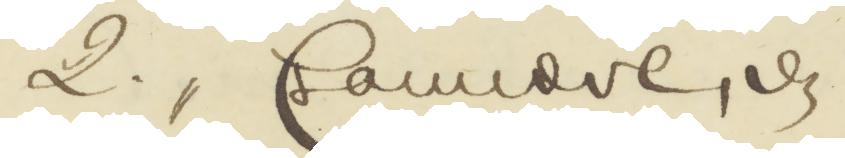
2. „ Canneel, en
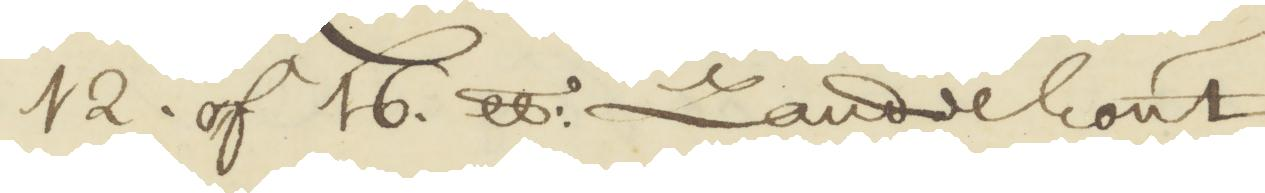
12. of 16. lb: Zandelhout
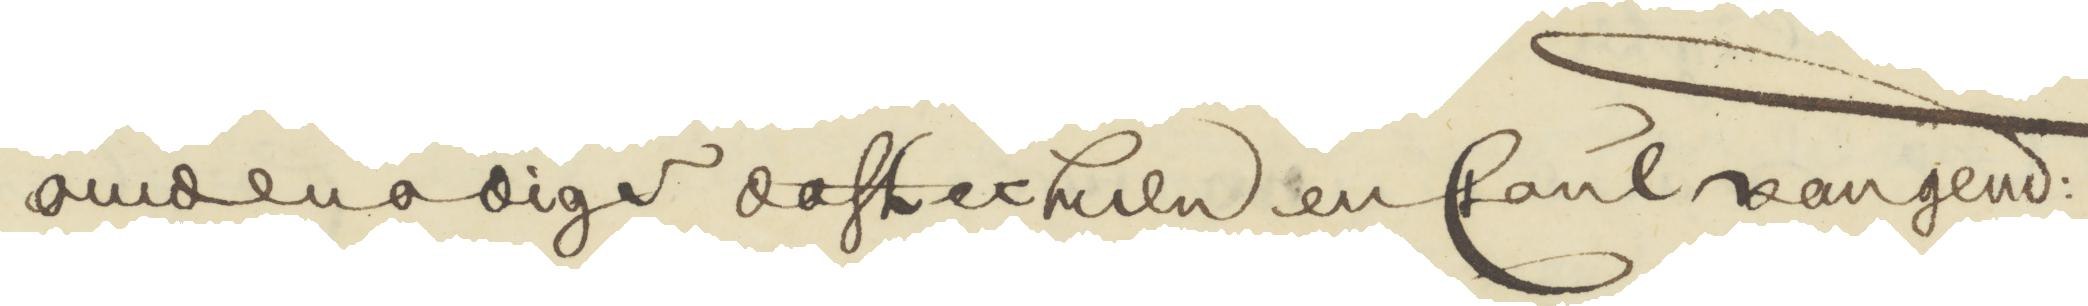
om de nodige dastecken en Caul van gend:
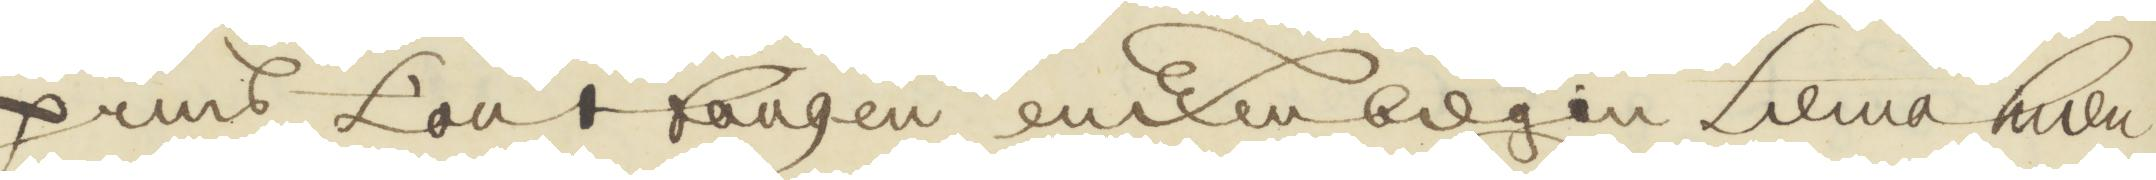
prins t' ontfangen en Een begin te maken
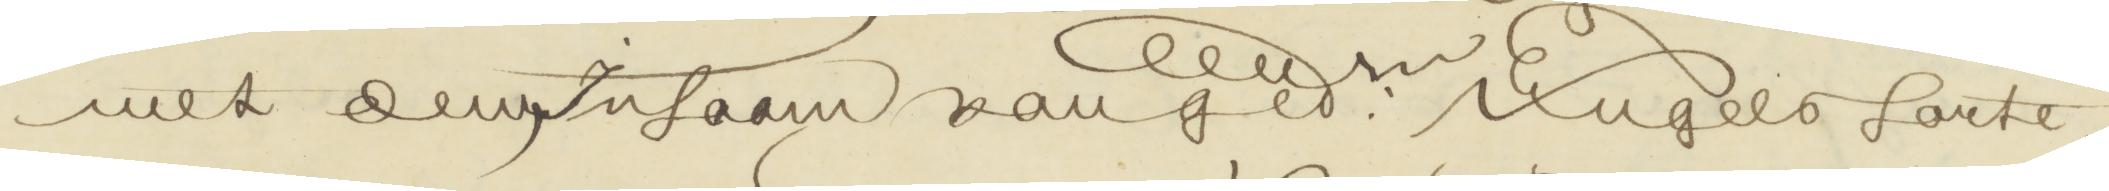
met dem Insaam van ged: Engels forte
